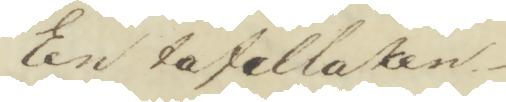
Een tafellaken. —
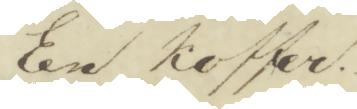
Een koffer.
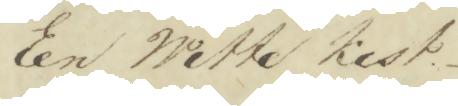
Een Witte kist.
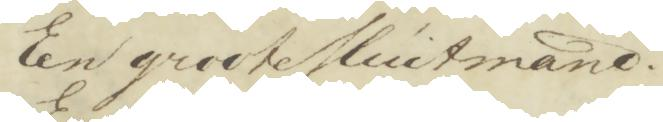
Een groote sluitmand.
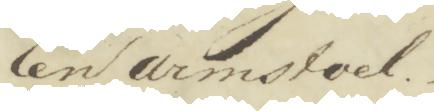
Een armstoel.
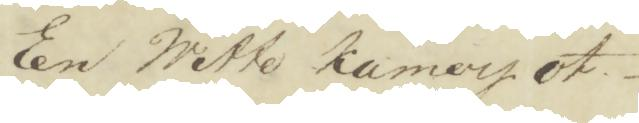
Een Witte kamerpot.
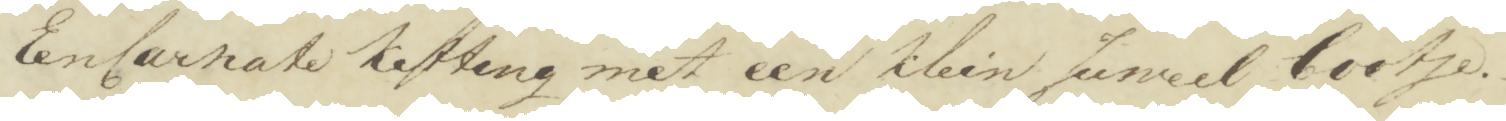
Een Carnate ketting met een klein Juweel bootje.
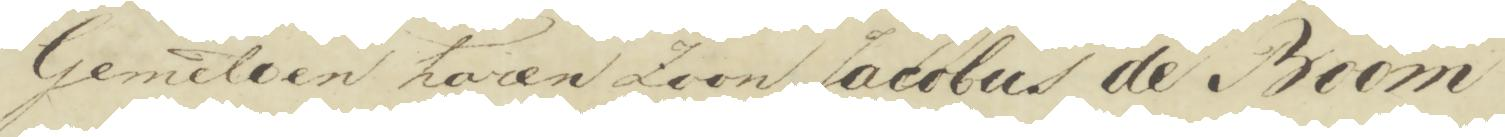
Gemelden haren zoon Jacobus de Boom
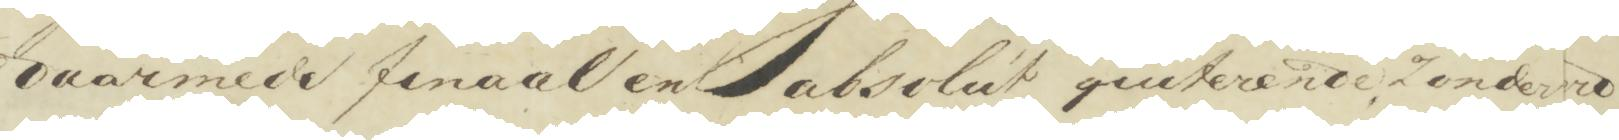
daarmede finaal en absolut quiterende, zonder
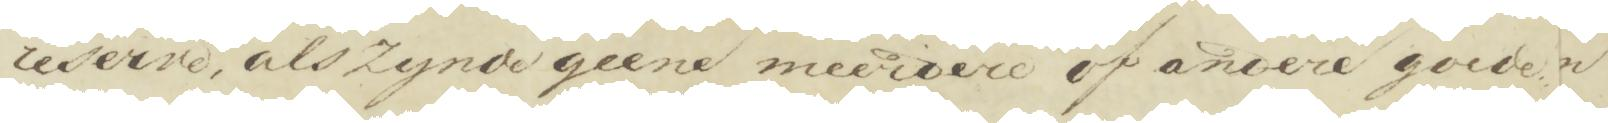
reserve, als zynde geene meerdere of andere goede
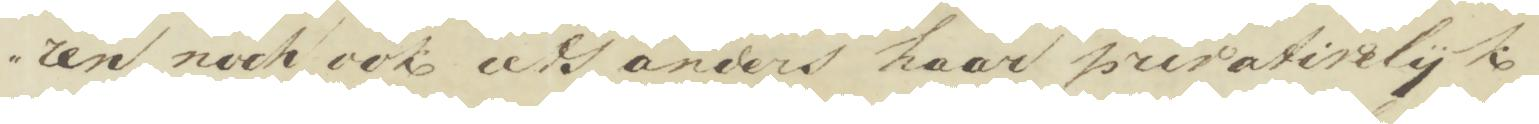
„ren, noch ook iets anders haar privativelijk
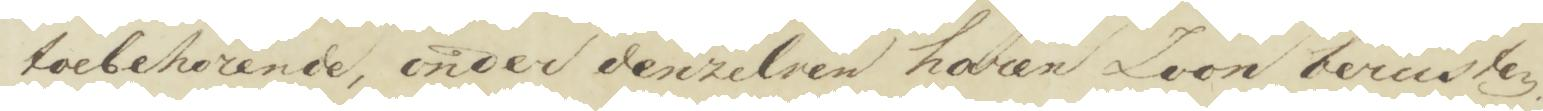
toebehorende, onder denzelven haren zoon berusten„
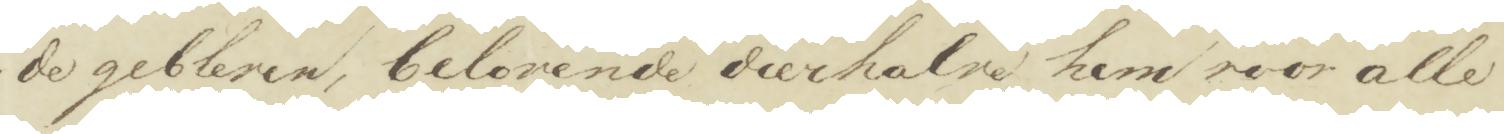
de gebleven, belovende dierhalve hem voor alle
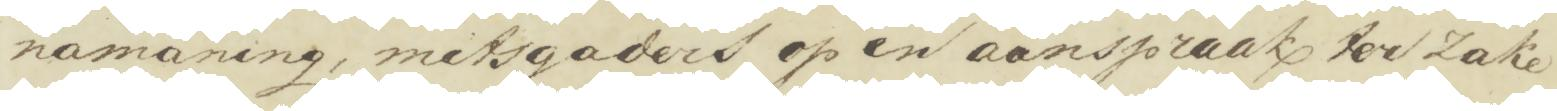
namaning, mitsgaders op en aanspraak ter zake
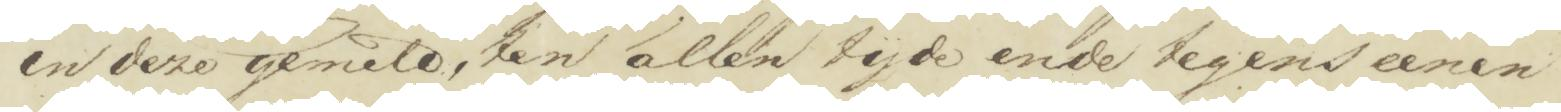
in deze gemeld, ten allen tijde ende tegens eenen
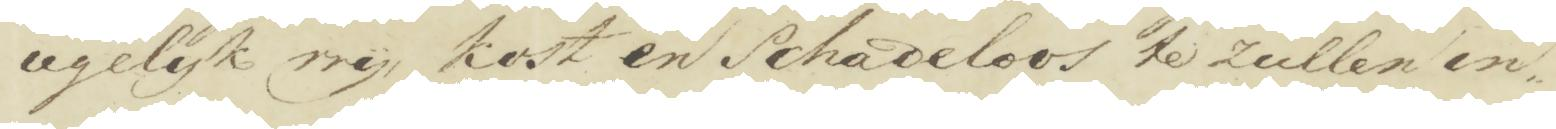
iegelyk vrij, kost en schadeloos te zullen in„
